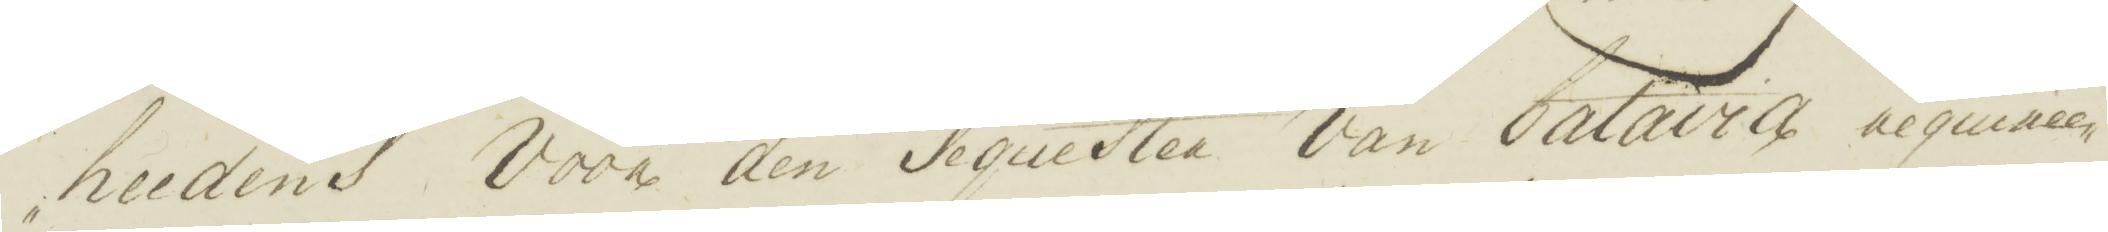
„heedens voor den sequester van batavia requiree„
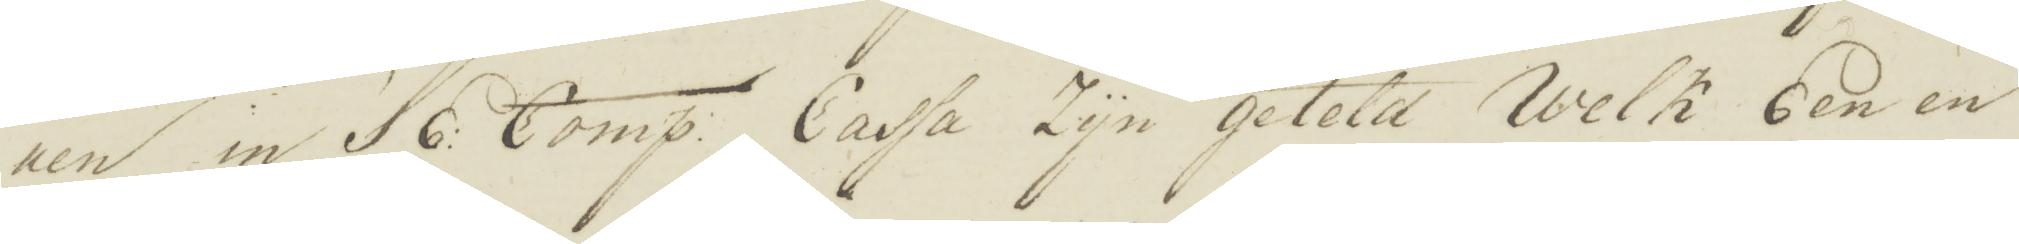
ren in 'sE: Comp:' Cassa zijn geteld welk Een en
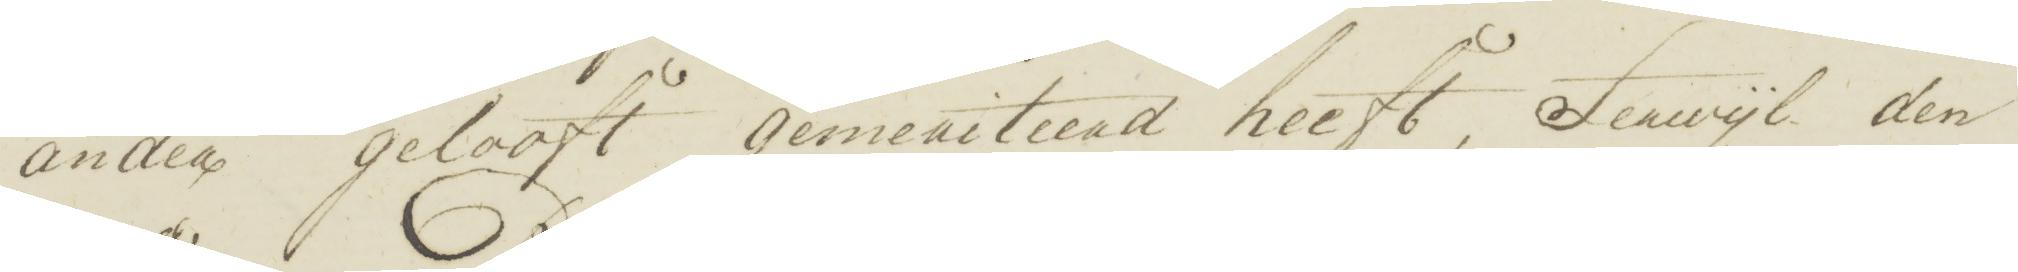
ander gelooft gemeriteerd heeft, terwijl den
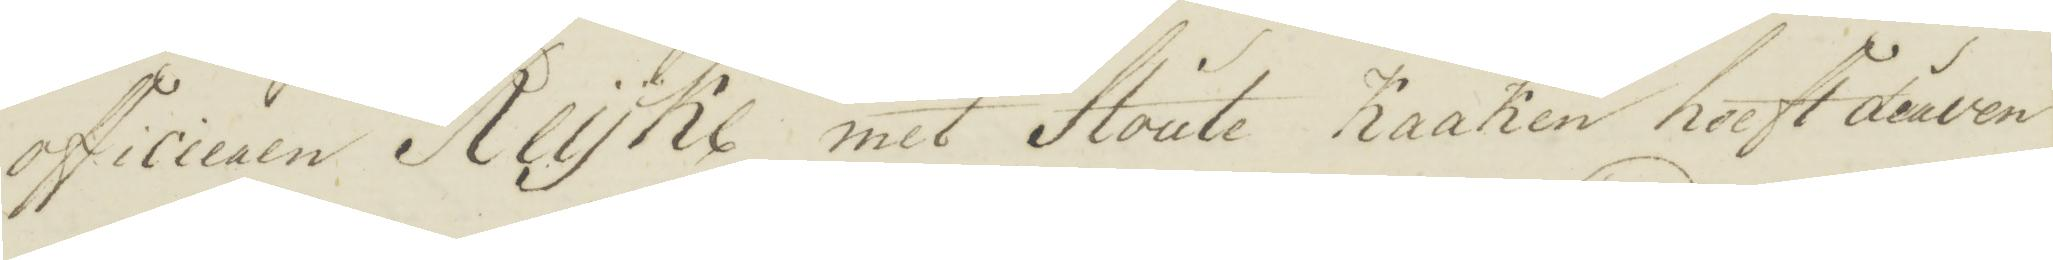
officieren Reijke met stoute kaaken heeft durven
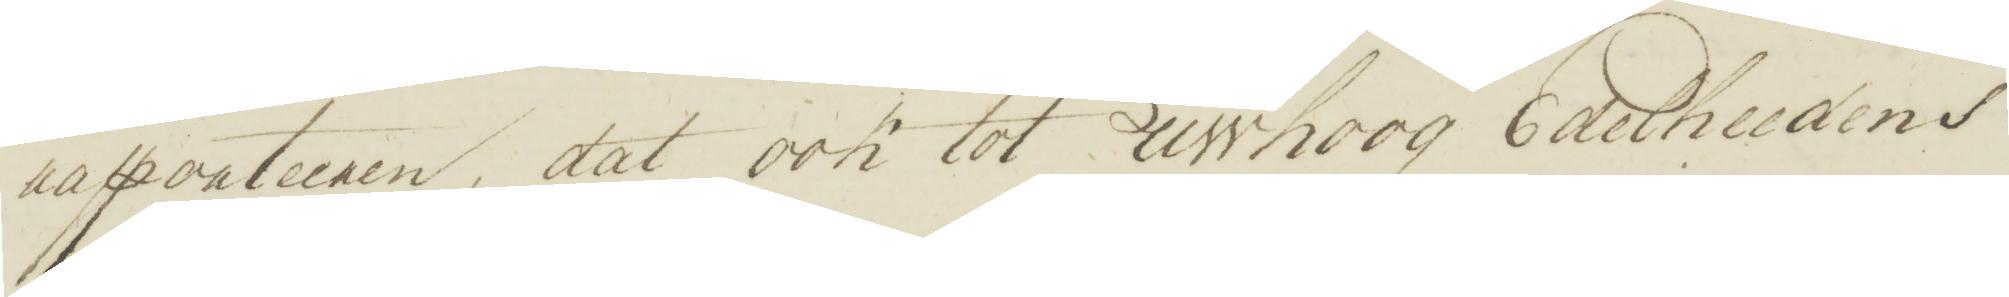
rapporteeren, dat ook tot uwhoog Edelheedens
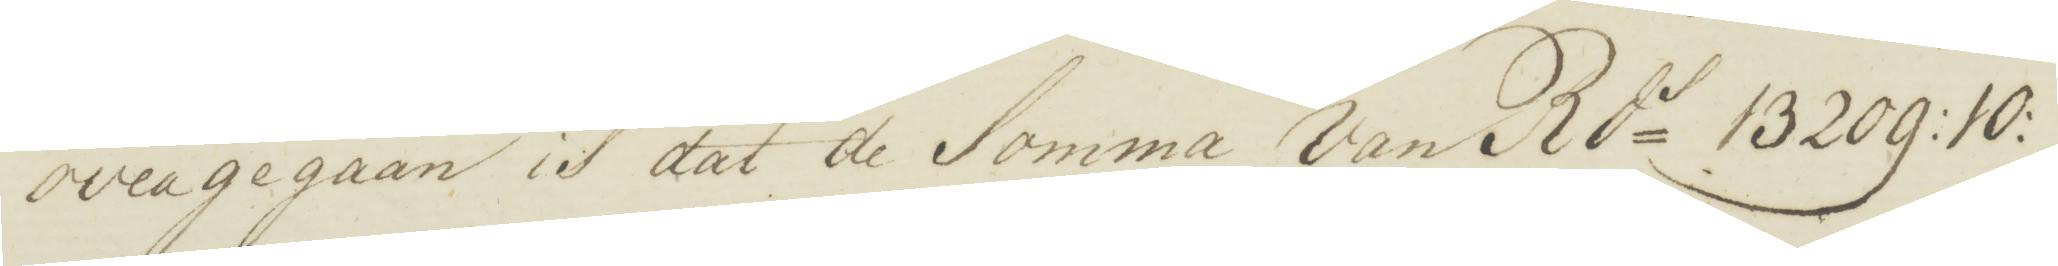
overgegaan is dat de somma van Rd=s 13209:10:
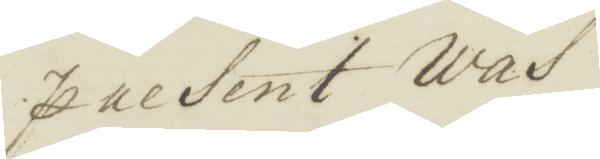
present was
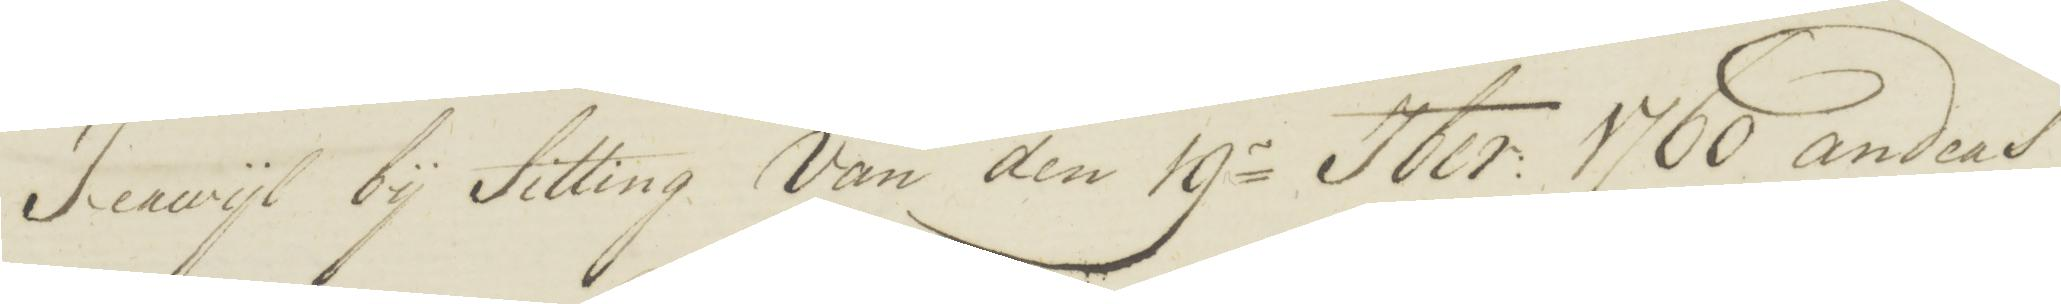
Terwijl bij sitting van den 19=' Iber: 1760 anders
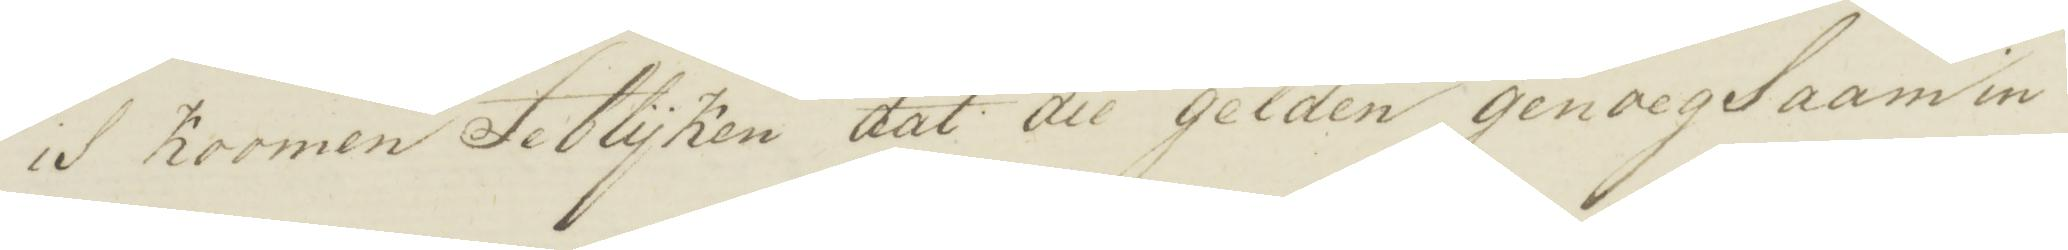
is koomen teblijken dat die gelden genoegsaam in
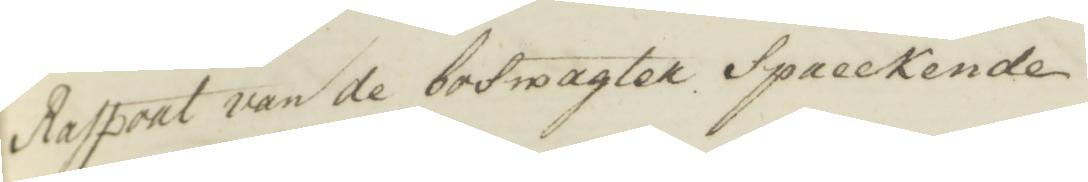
Rapport van de boswagter spreekende
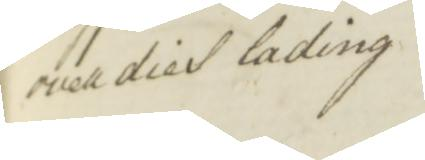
over dies lading
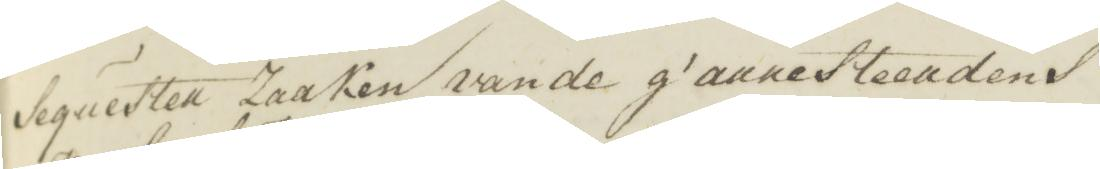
sequester zaaken van de g’arresteerdens
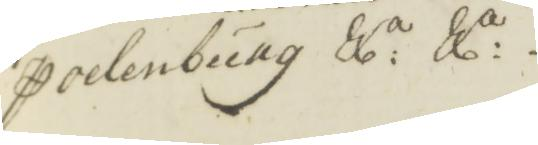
poelenburg E:a E:a
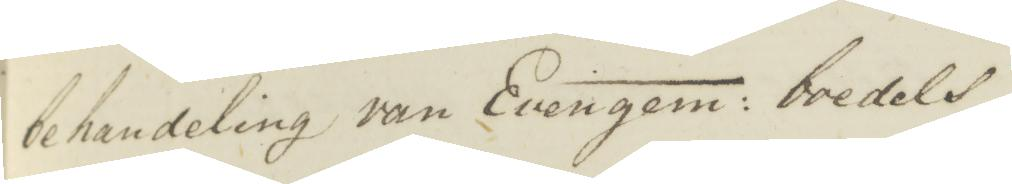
behandeling van Evengem: boedels
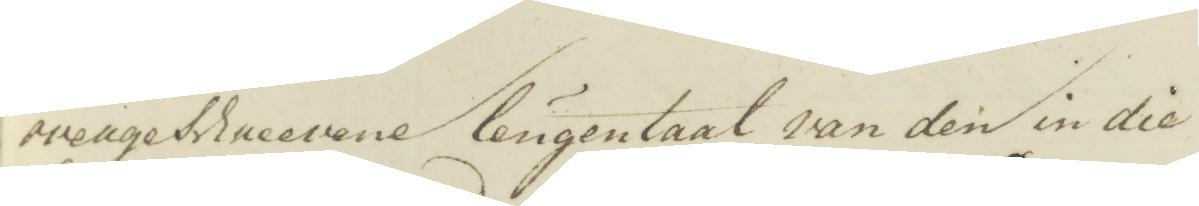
overgeschreevene leugentaal van den in die
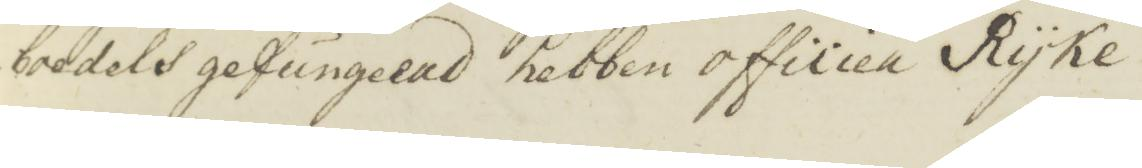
boedels gefungeerd hebben officier Rijke
